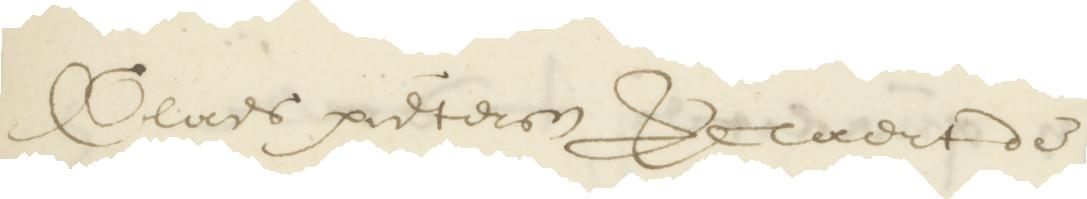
Claes pieters verclaert de
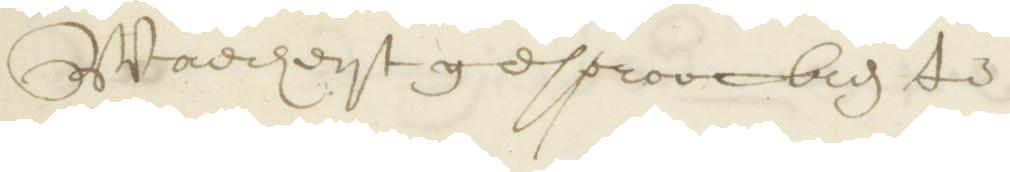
Waerheyt gesproocken te
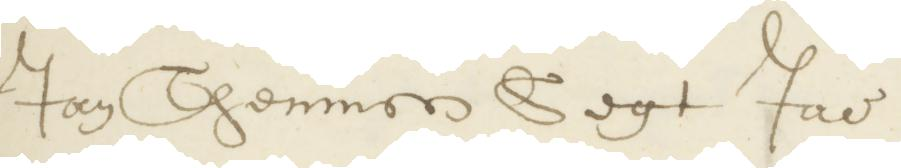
Jan Chenniss Segt Jae
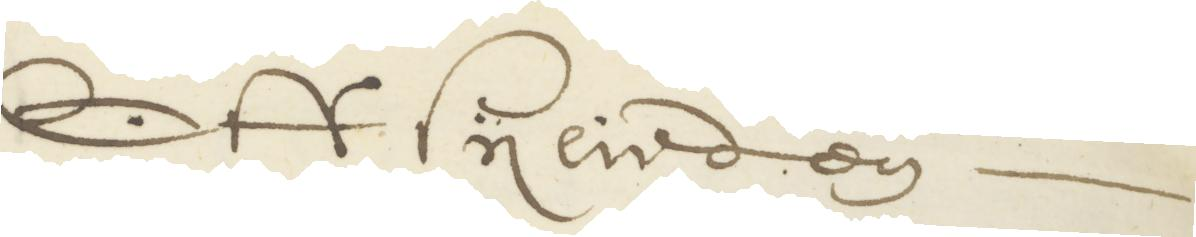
Off sij lieden —
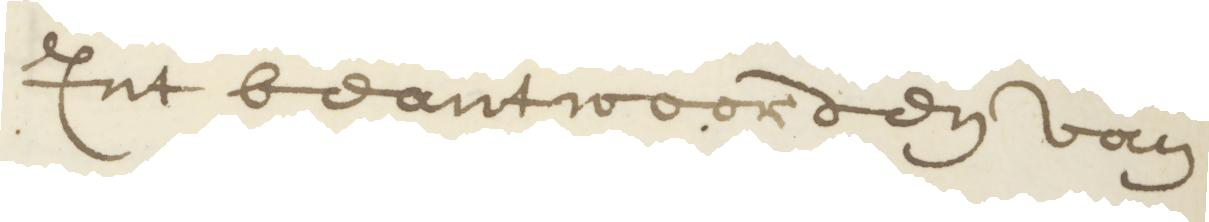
Jnt beantwoorden van
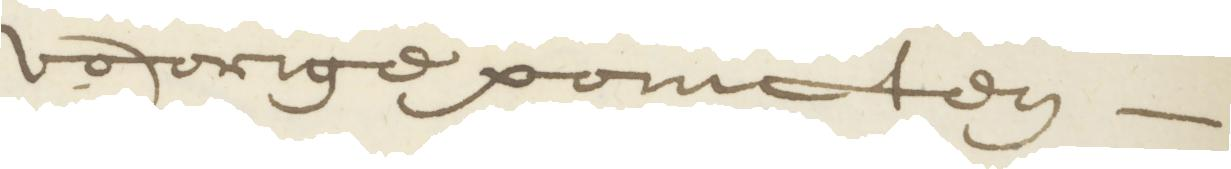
voorige poincten —
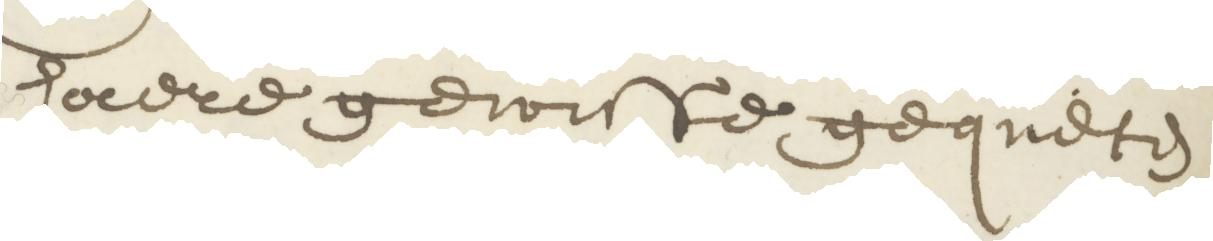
haere gewisse gequeten
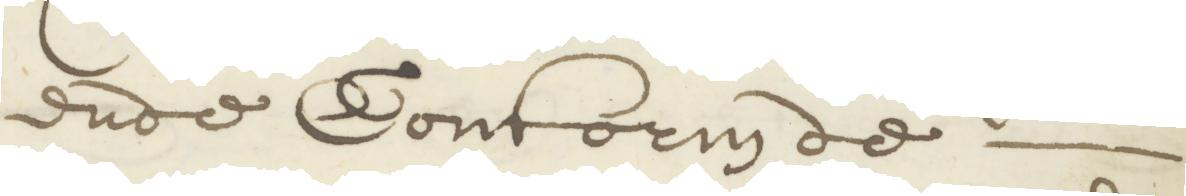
ende Conform de —
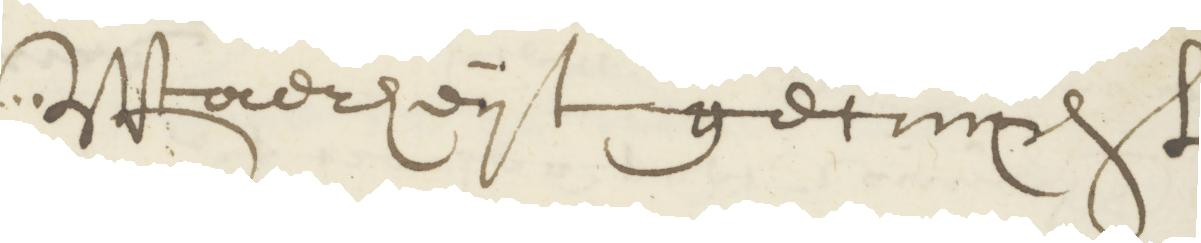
Waerheijt getuijcht
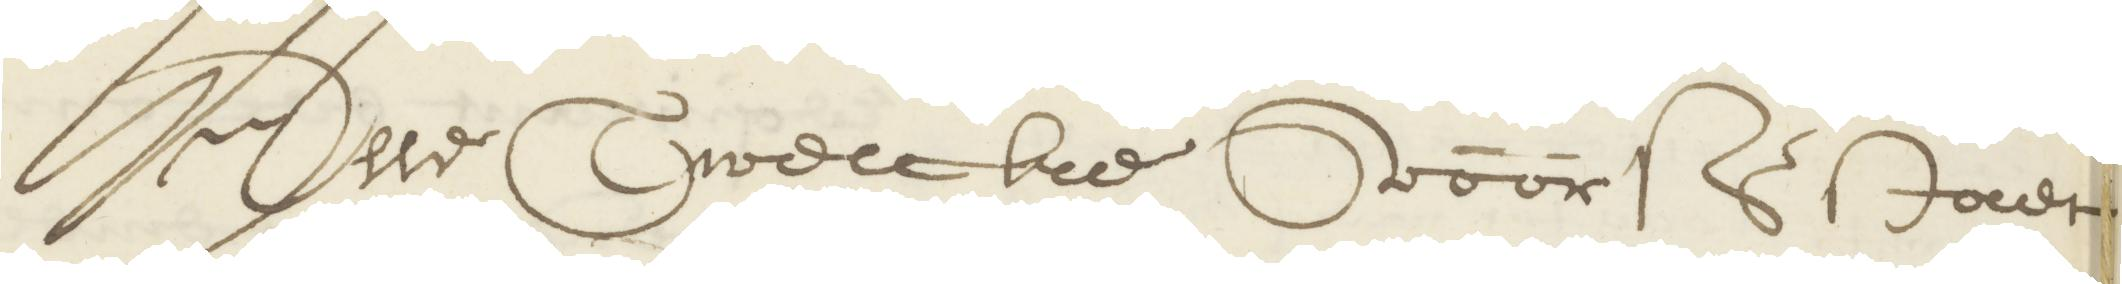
Alle Twelcke voorsz staet
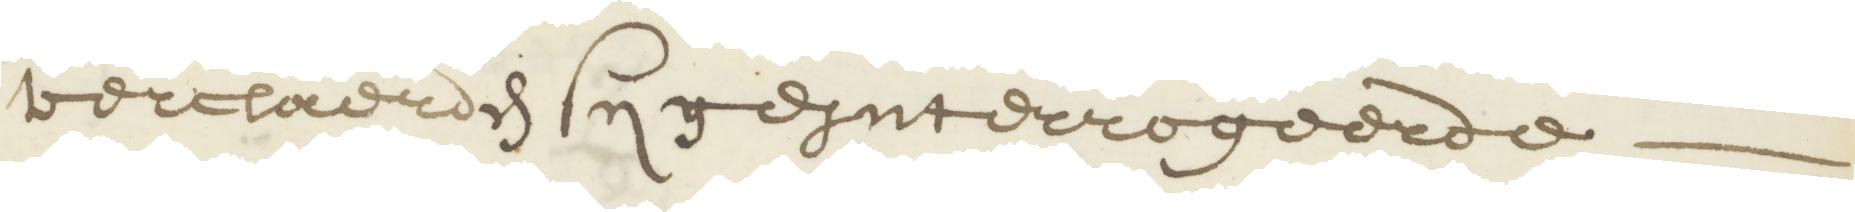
verclaerden sy gejnterrogeerde —
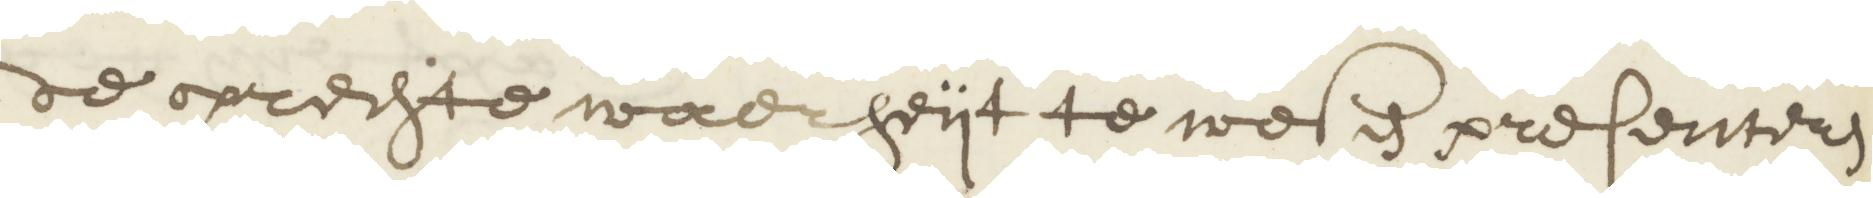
de oprechte waerheijt te wesen presenteren
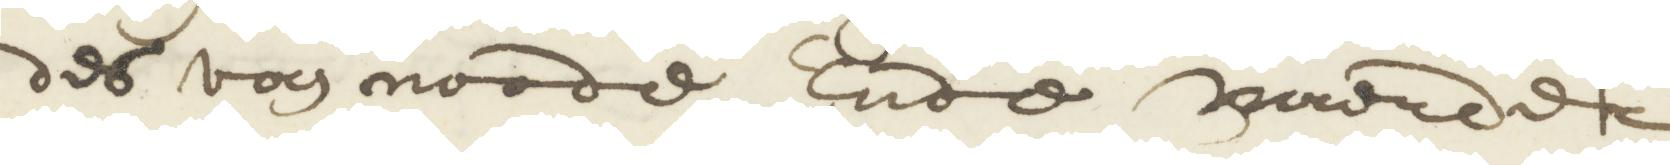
des voren noode ende veerder
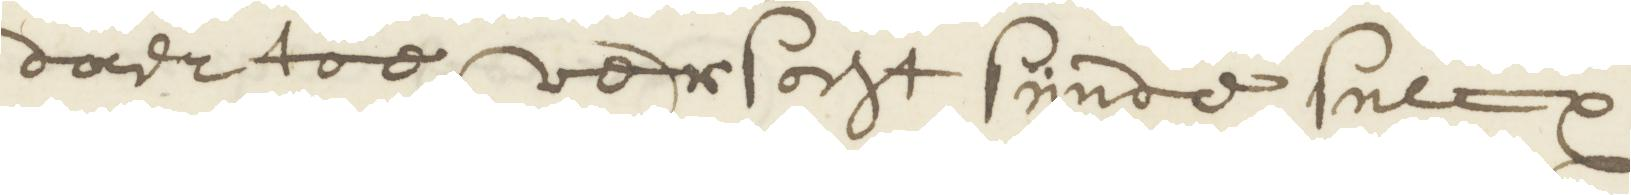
daer toe versogt sijnde sulcx
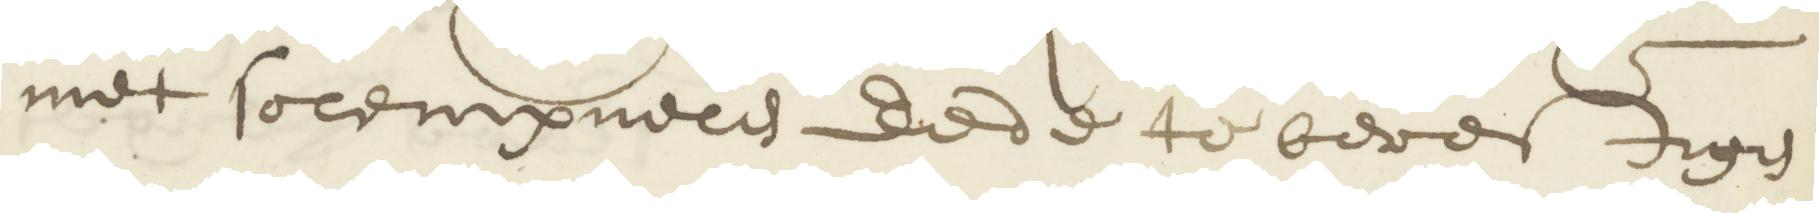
met solempnelen Eede te bevestigen
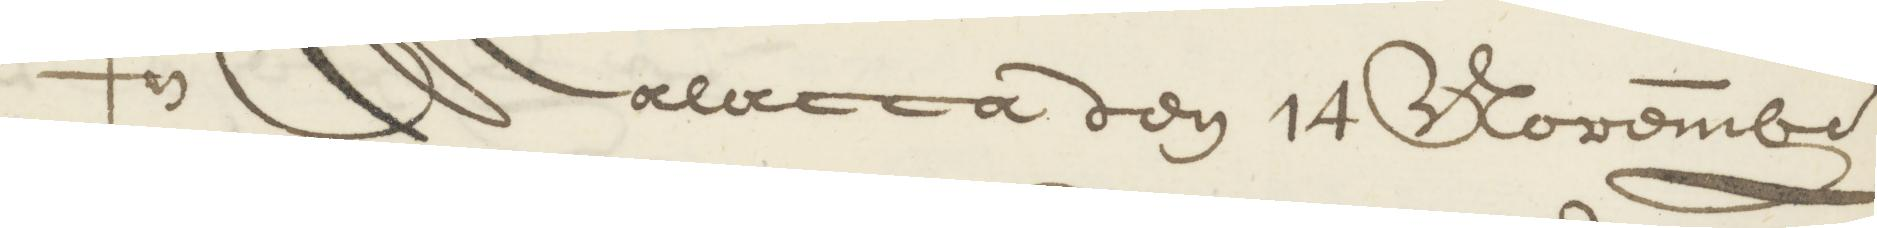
In Malacca den 14 Novembr
